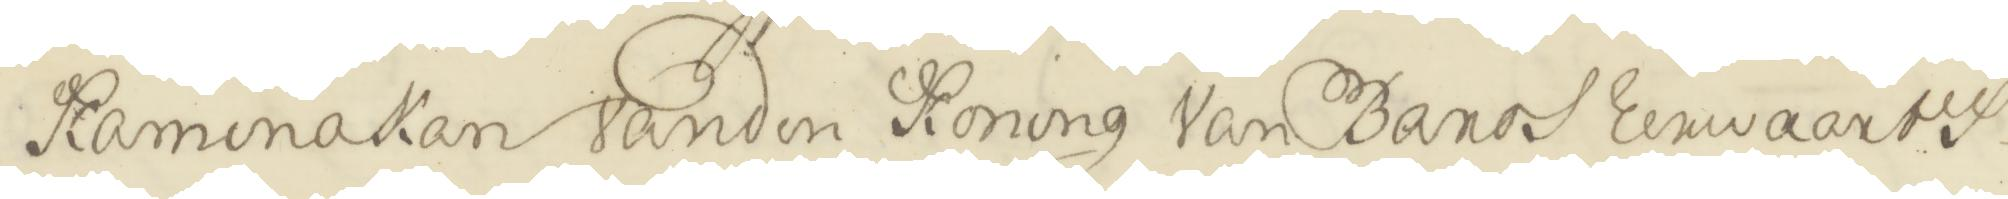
Kaminakan van den Koning van Baros herwaarts
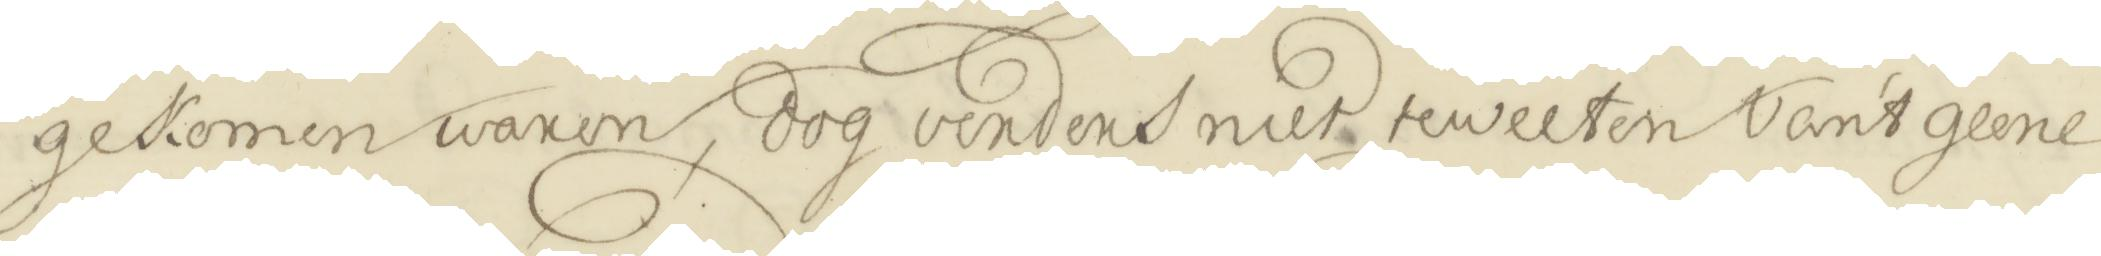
gekomen waren, dog verders niet teweeten van't geene
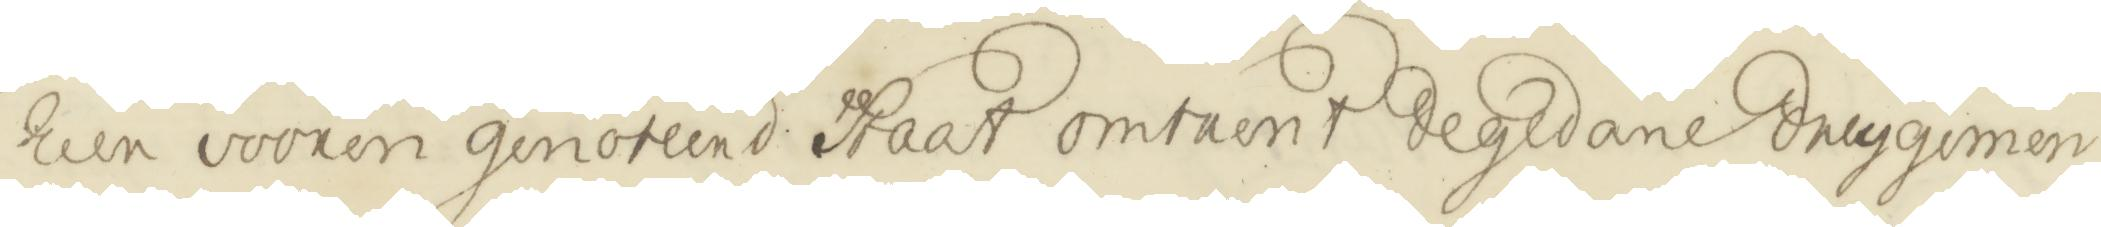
hier vooren genoteerd staat omtrent degedane dreygemen
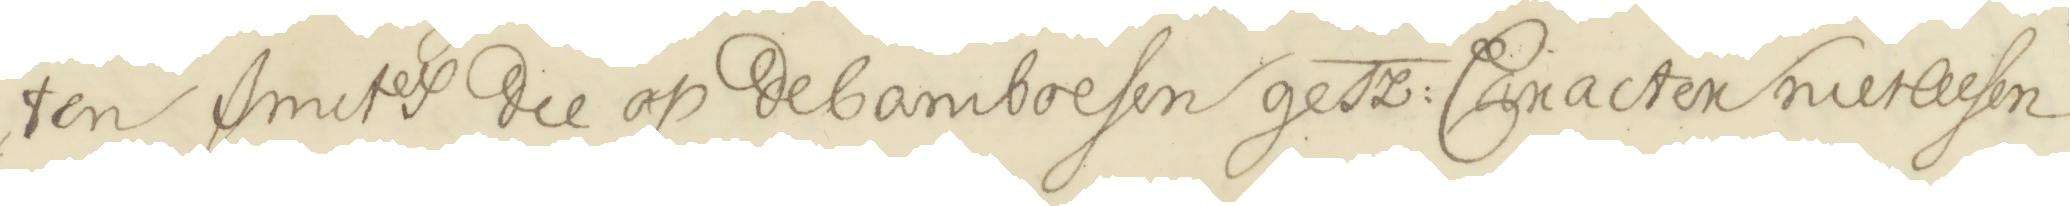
„ten vermits die op de bamboesen gesz: Caracter niet leesen
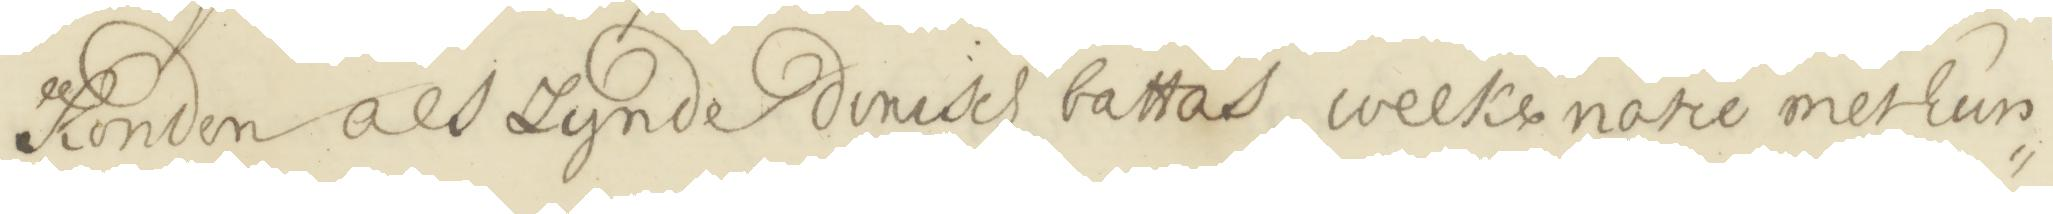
konden als zijnde dirisch battas, welke natie met hun„
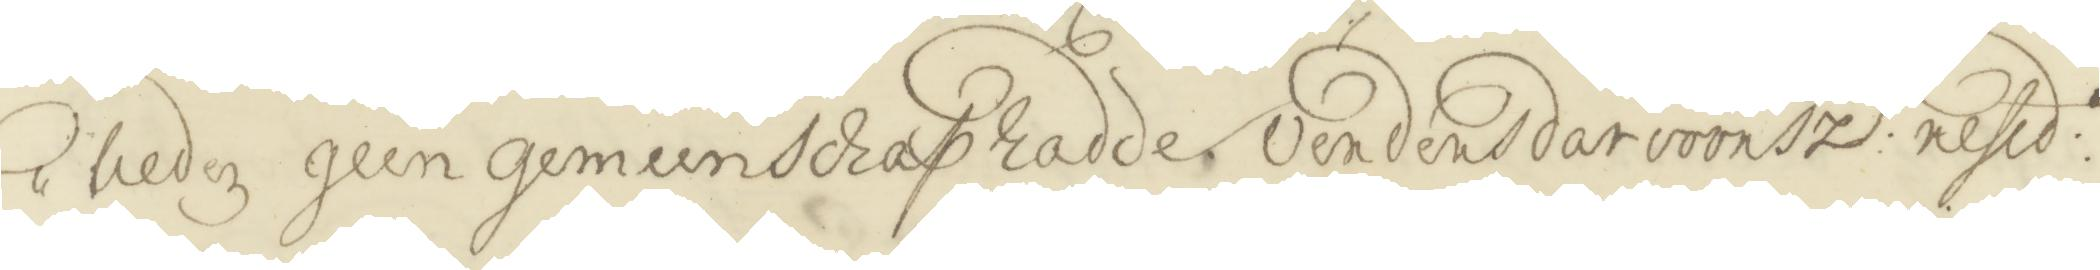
heden geen gemeenschap hadde verders dat voorsz: resid:t
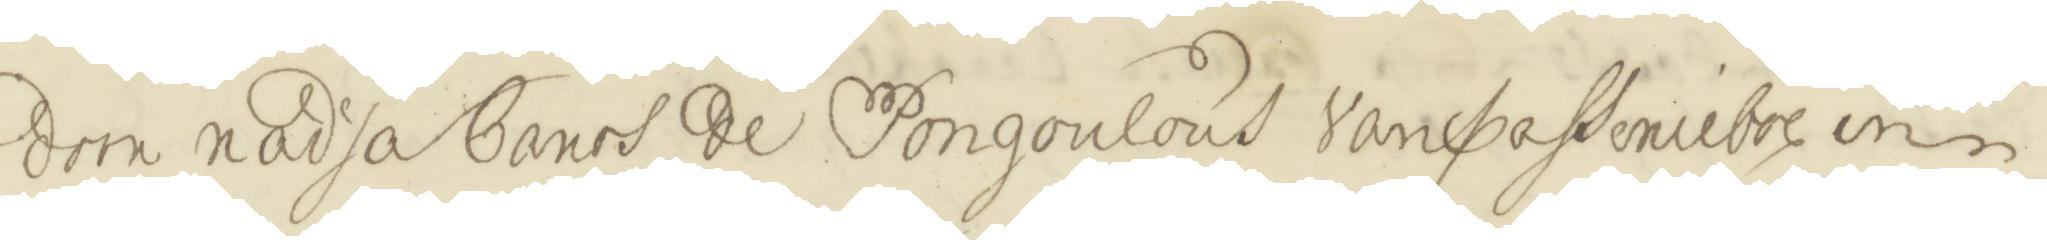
door radja baros de Pongoulous van passerieboe in
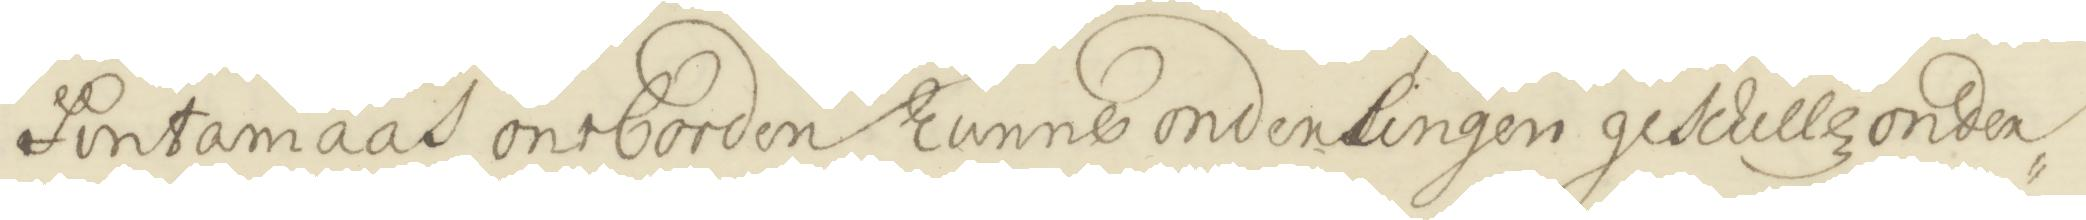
Tintamaas ontborden hunne onderlingen geschillen onder„
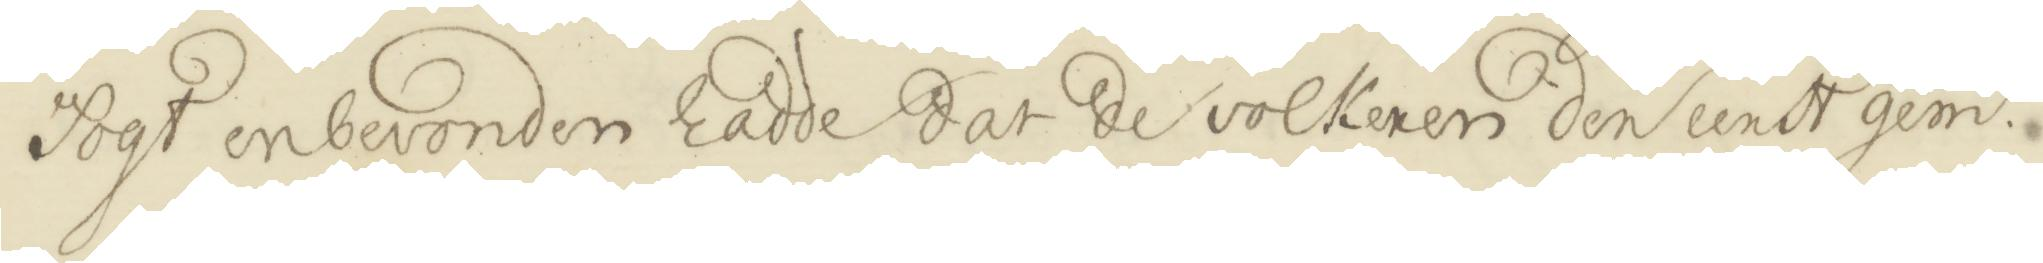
sogt enbevonden hadde dat de volkeren der eerst gem:
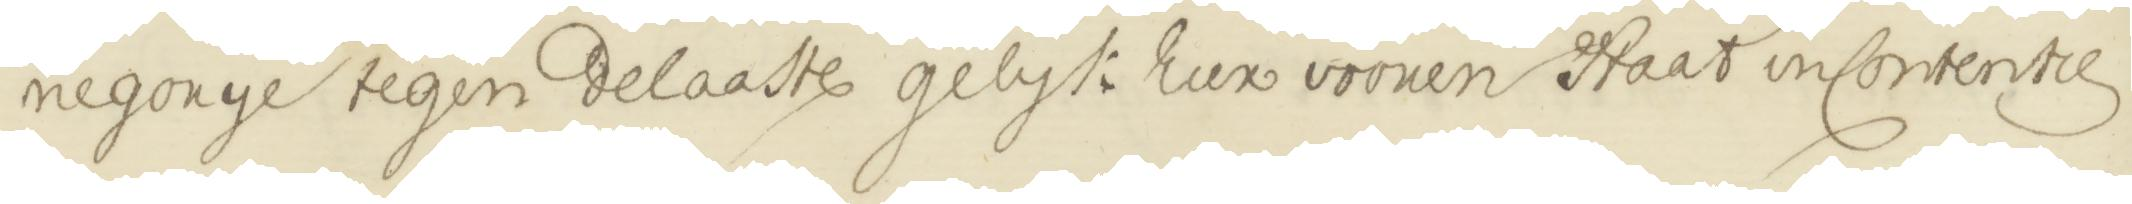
negorije tegen delaaste gelyk hier vooren staat in contentie
